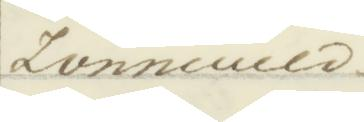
Zonneveld
